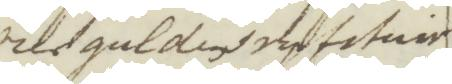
vier guldens vyf stuiv
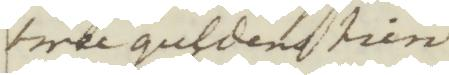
twee guldens tien
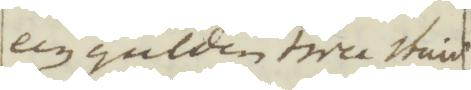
een gulden twee stuiv
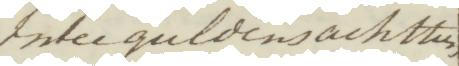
twee guldens achttien
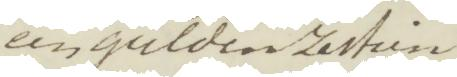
een gulden zestien
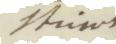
stuivs
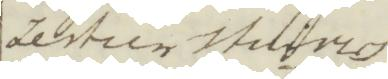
zestien stuivers
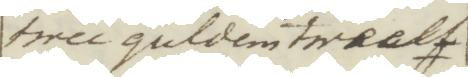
twee gulden twaalf
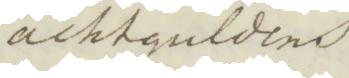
acht guldens
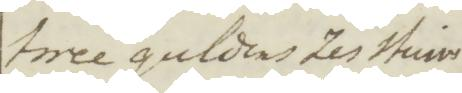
twee guldens zes stuivr
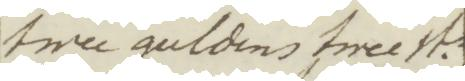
twee guldens twee sts
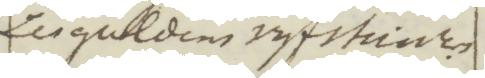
Zes guldens vyf stuivers
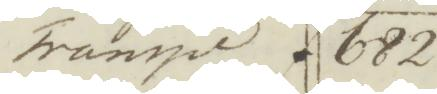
Transpt ƒ682
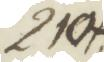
210#
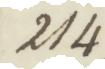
214
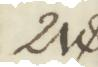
218
